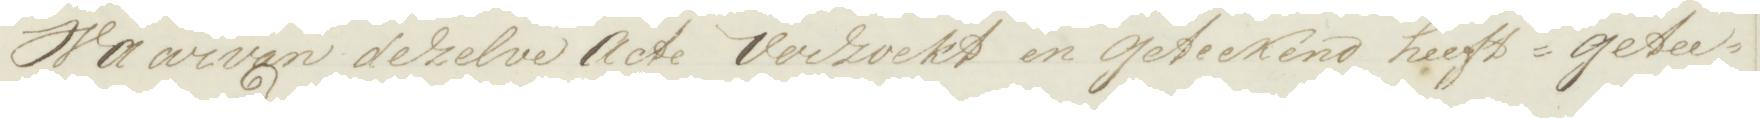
Waarvan dezelve Acte verzoekt en geteekend heeft = getee„
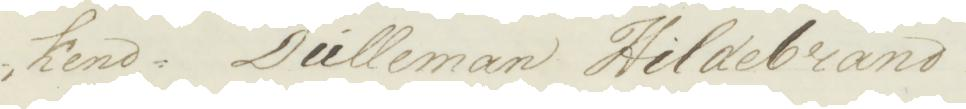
„kend: Dulleman Hildebrand
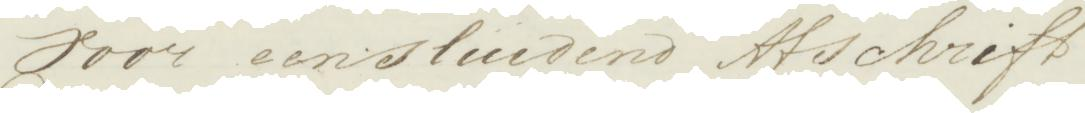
voor eensluidend Afschrift
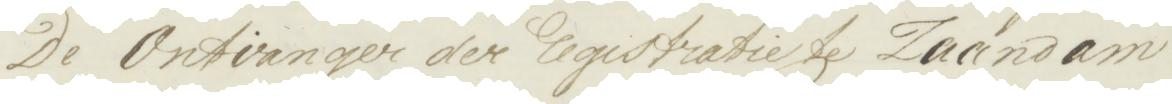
De Ontvanger der Registratie te Zaandam
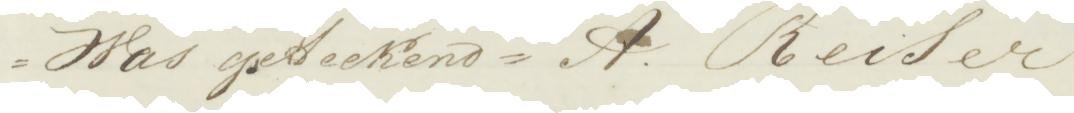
= Was geteekend = A. Reiser
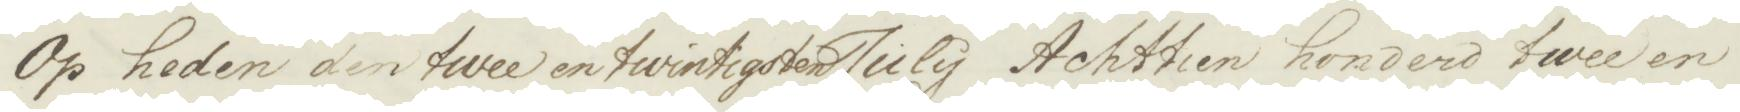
Op heden den twee en twintigsten Julij Achttien honderd twee en
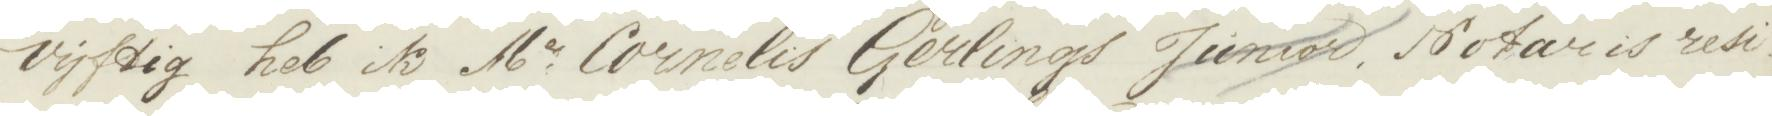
vijftig heb ik M:r Cornelis Gerlings Junior, Notaris resi
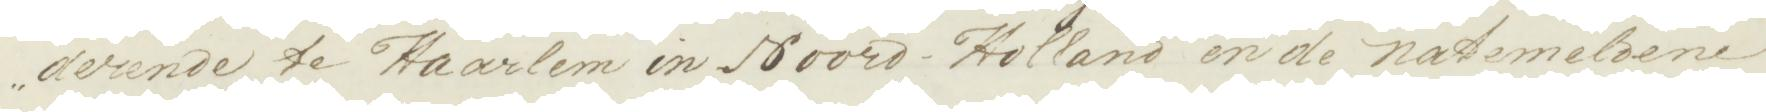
„derende te Haarlem in Noord-Holland en de natemeldene
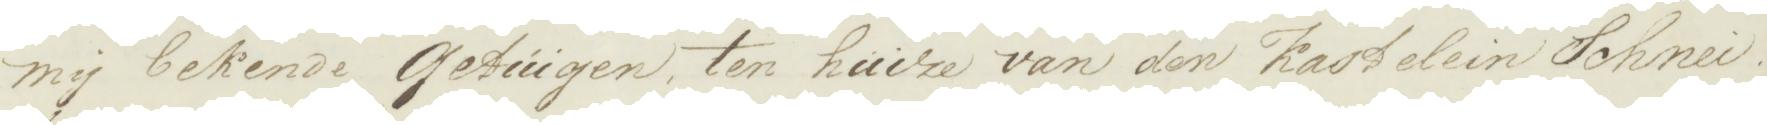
mij bekende Getuigen, ten huize van den Kastelein schnei
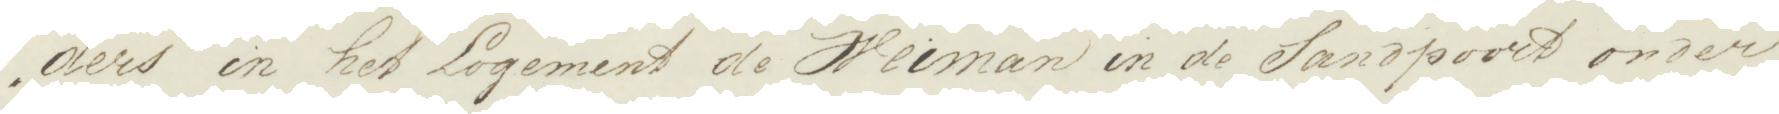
„ders in het Logement de Weiman in de Sandpoort onder
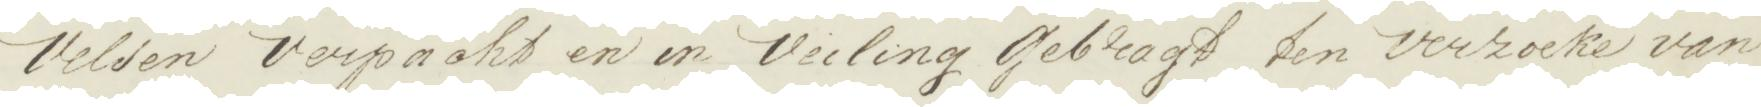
Velsen verpacht en in veiling gebragt ten verzoeke van
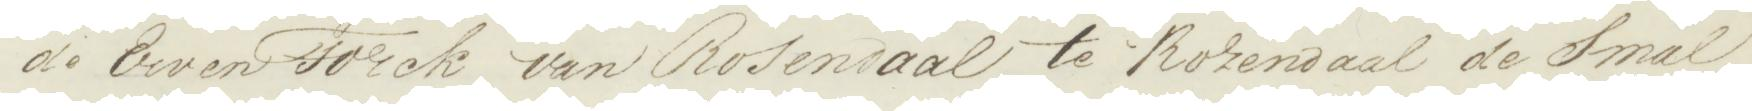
de Erven Torck van Rosendaal te Rozendaal de Smal
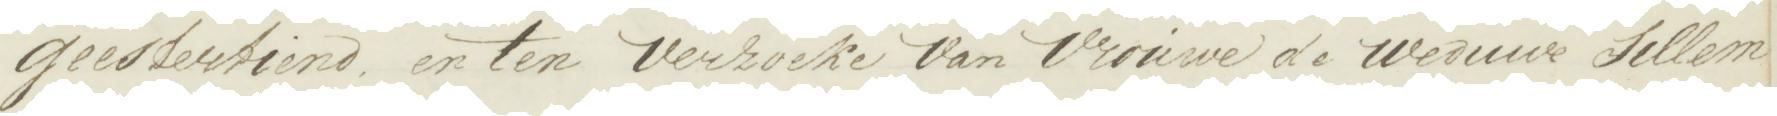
geestertiend, en ten verzoeke van Vrouwe de weduwe Sillem
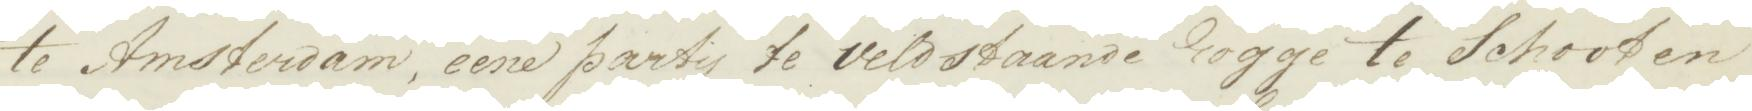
te Amsterdam, eene partij te veldstaande rogge te schooten
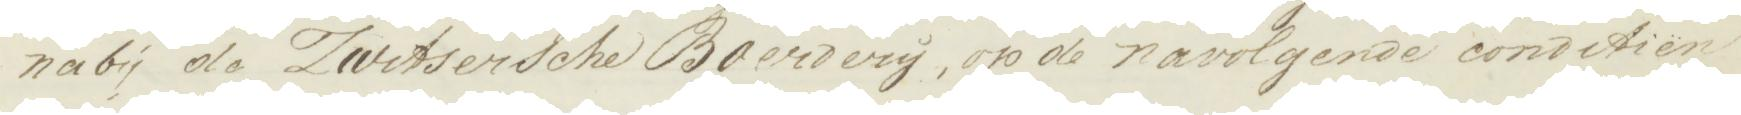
nabij de Zwitsersche Boerderij, op de navolgende conditiën
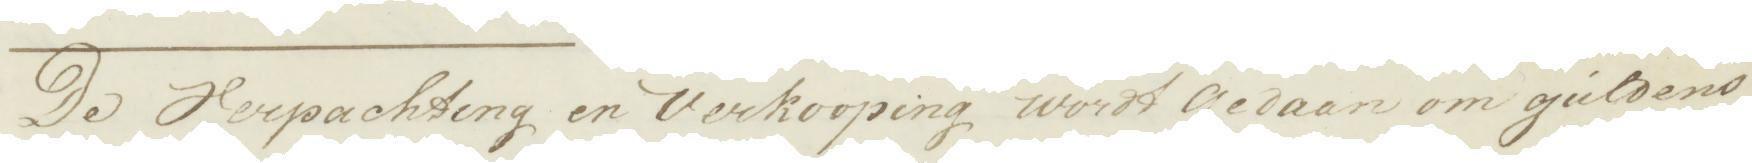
De Verpachting en verkooping wordt gedaan om guldens
